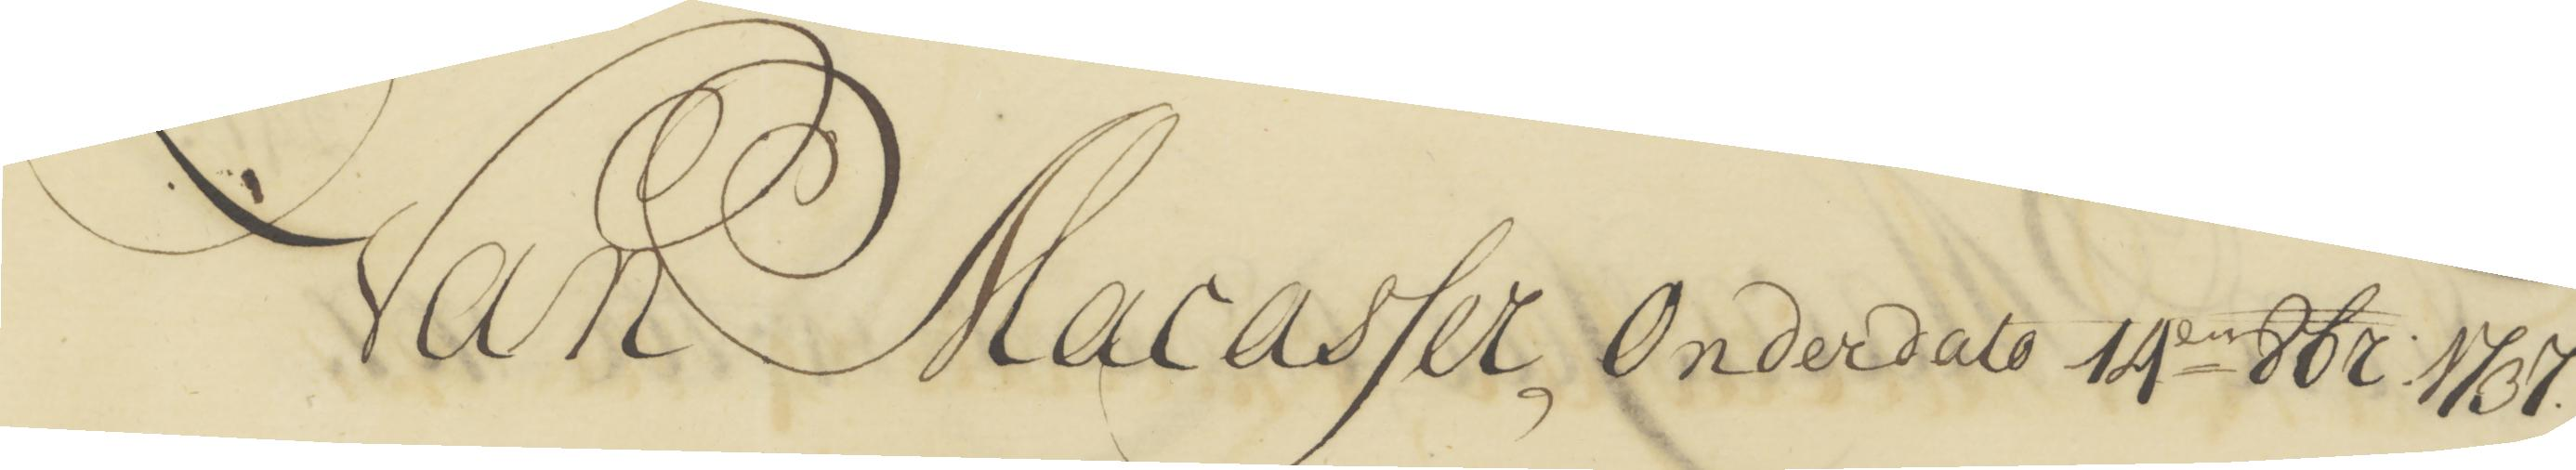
Van Macasser, Onder dato 14=en 8br: 1737.
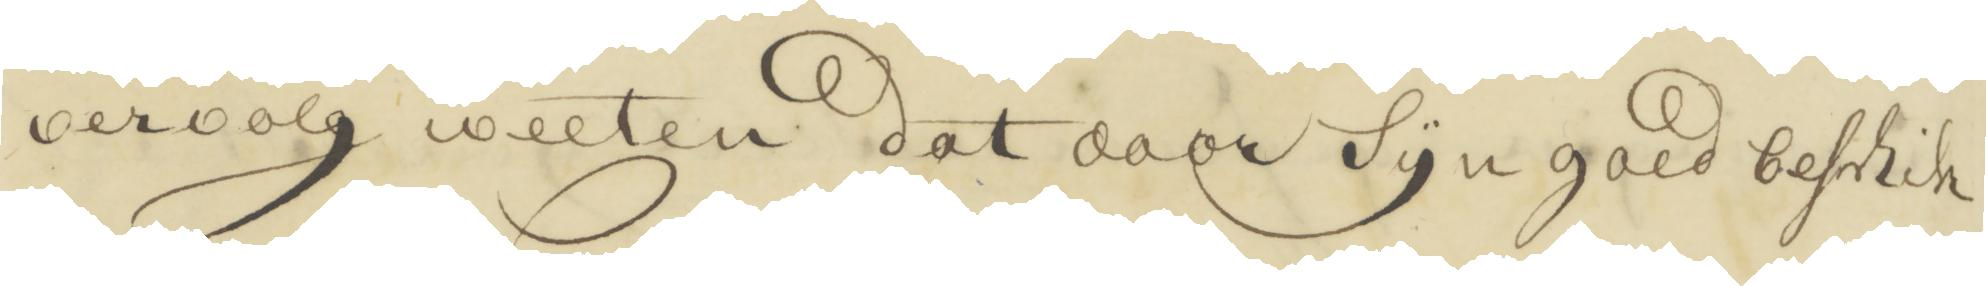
vervolg weeten dat door sijn goed beschik
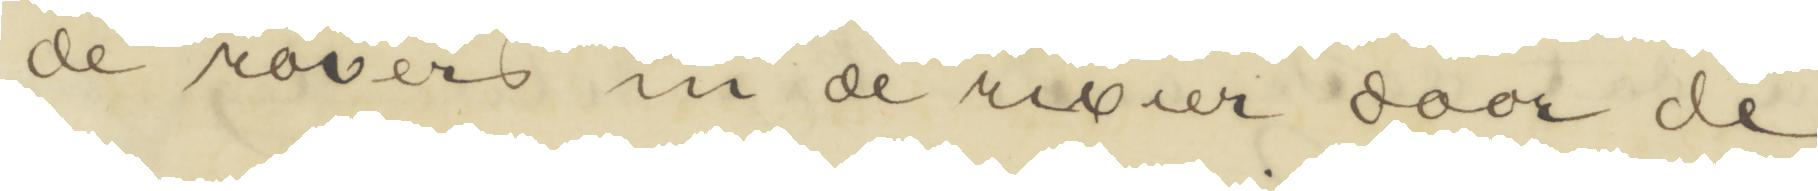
de rovers in de rivier door de
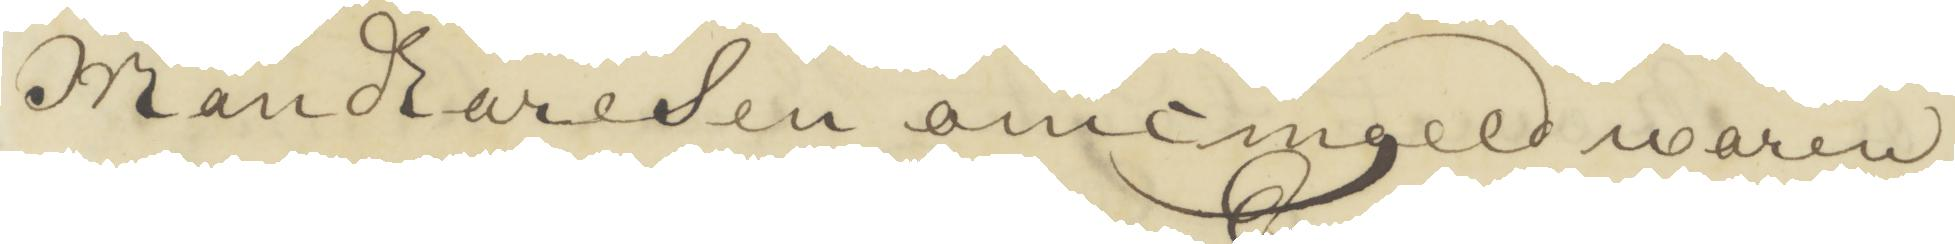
Mandharesen omcingeld waren,
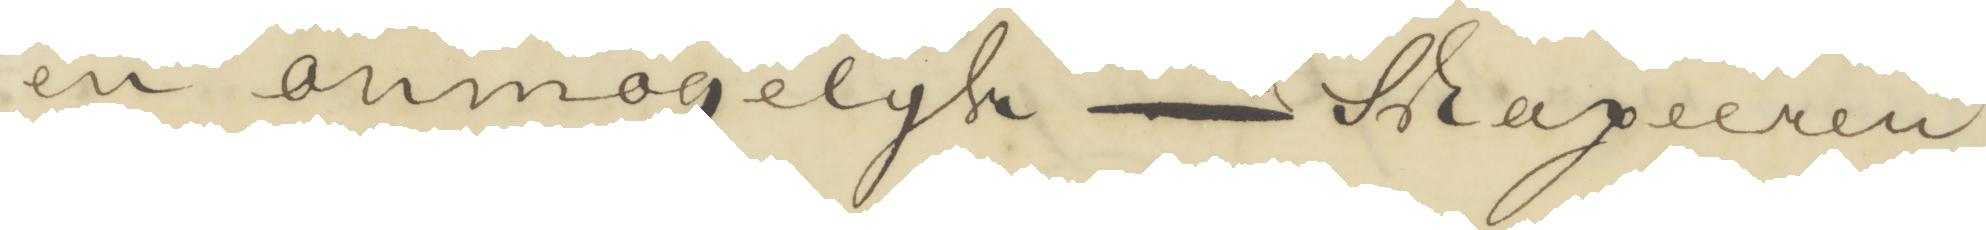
en onmogelijk _ schapeeren
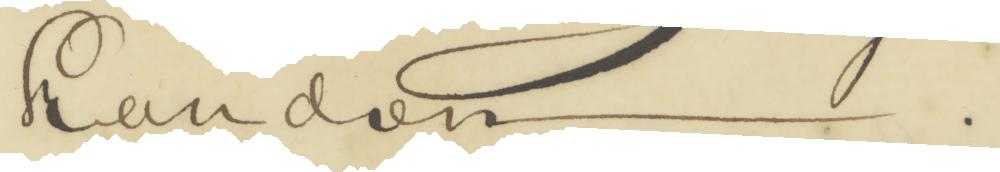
kanden.
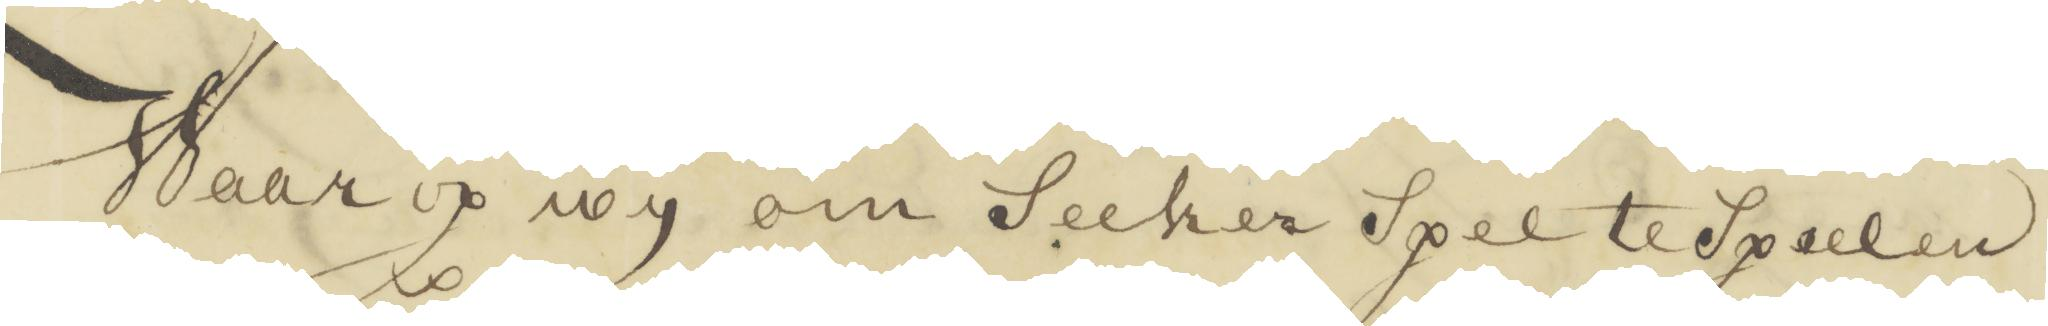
Waar op wij om seeker spel te speelen
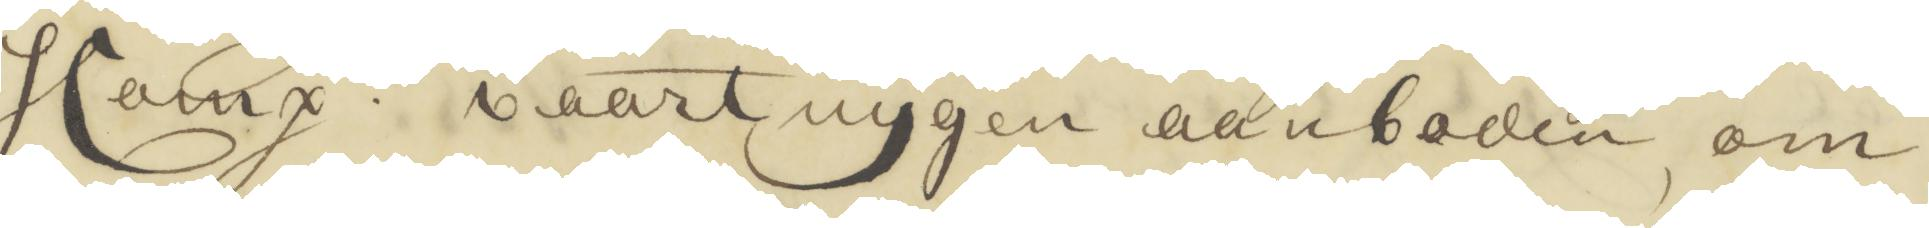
'sComp:s vaartuijgen aanboden, om
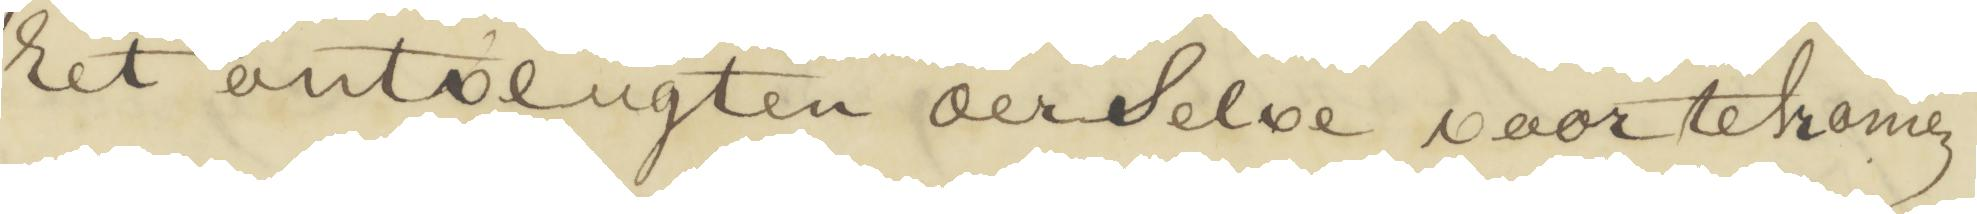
het ontvlugten derselve voor te komen
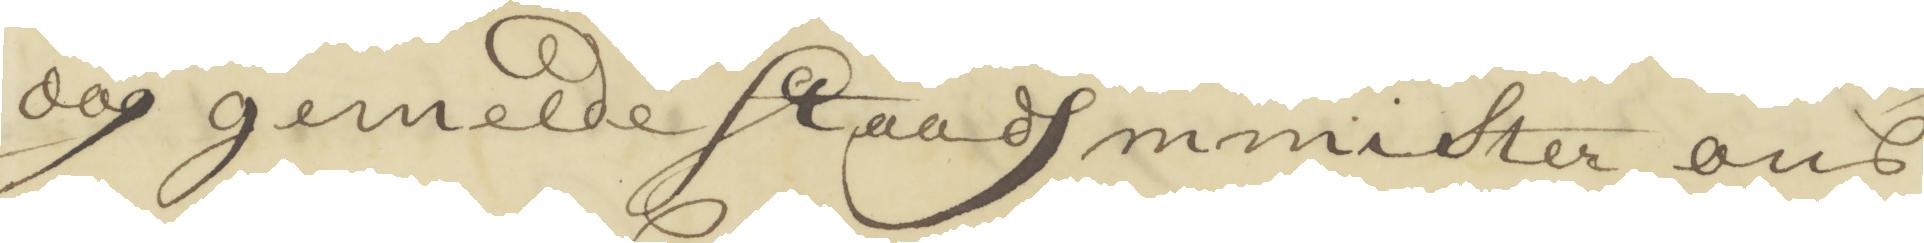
dog gemelde staads minister ons
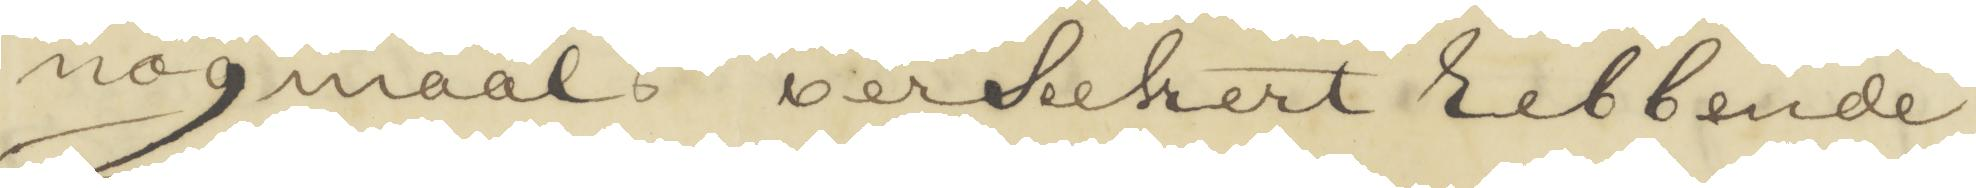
nogmaals verseekert hebbende,
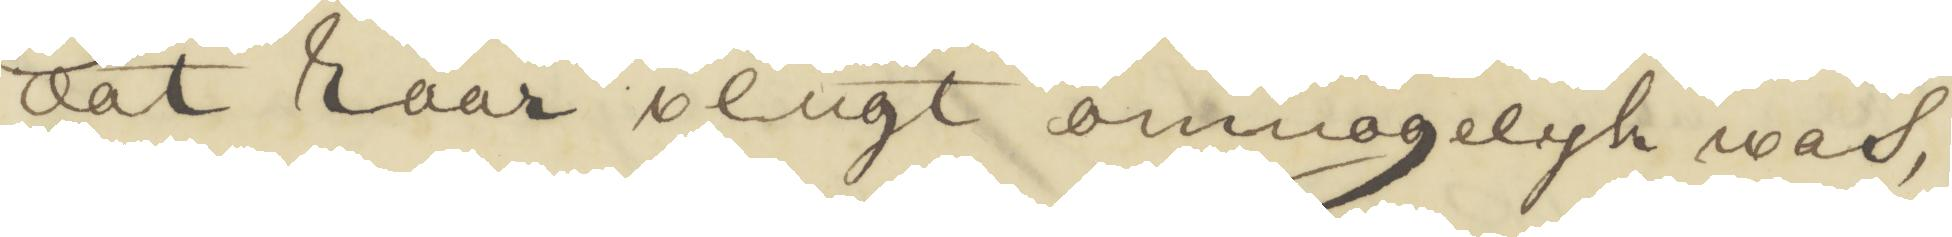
dat haar vlugt omnogelijk was,
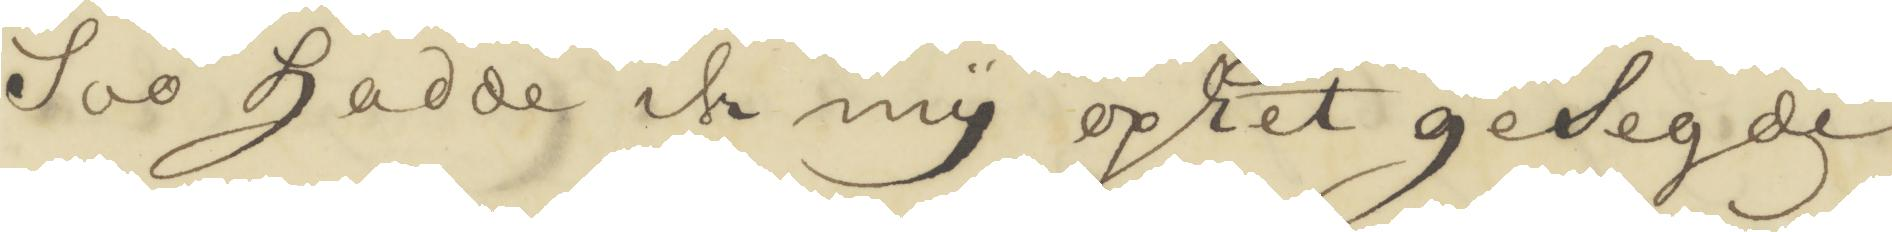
soo hadde ik mij op het gesegde
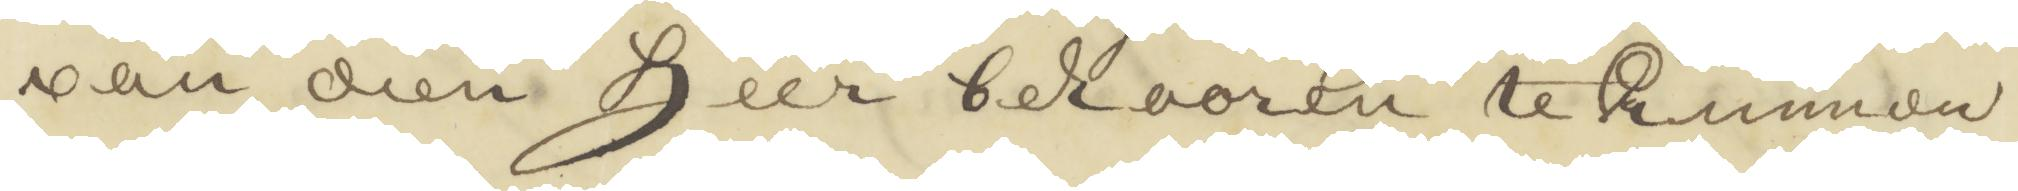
van dien heer behooren te kunnen
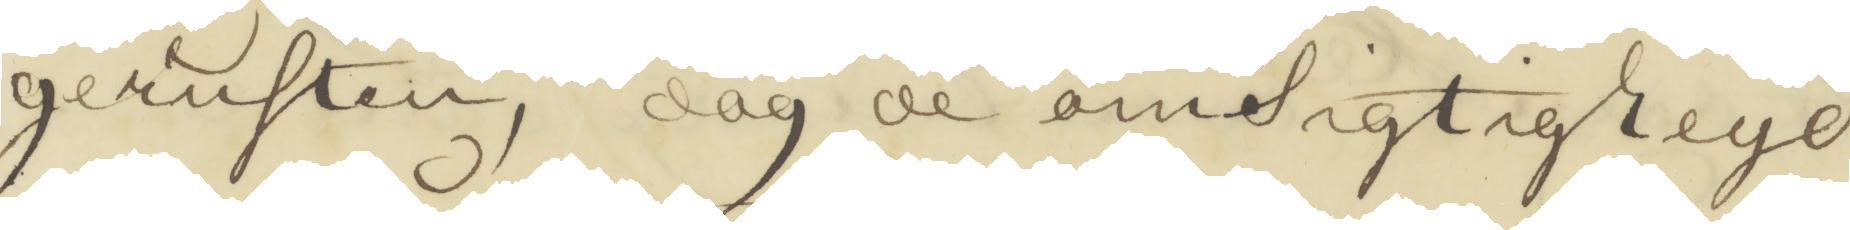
gerusten, dog de omsigtigheijd
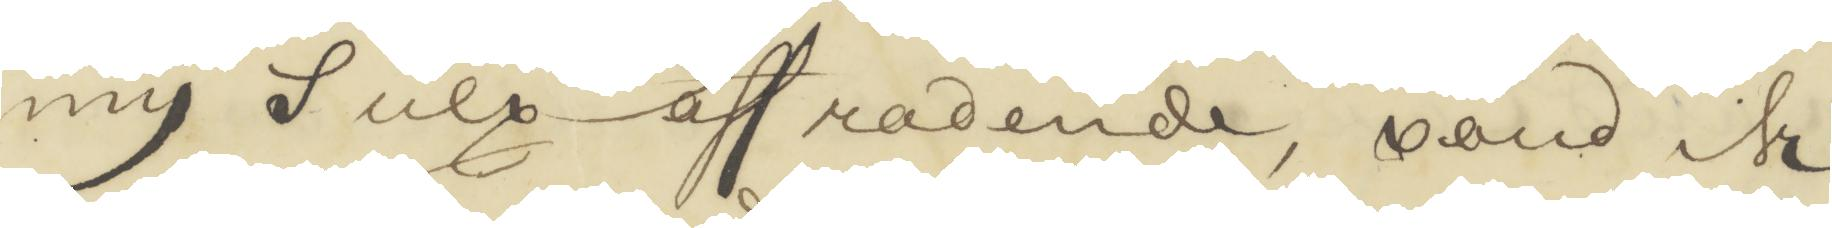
mij sulx aff radende, vand ik
